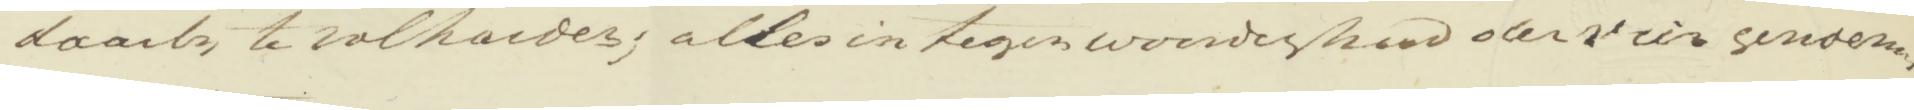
daarby te volharden; alhier in tegenwoordigheid der vier genoem
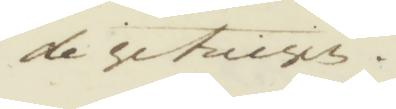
de getuigen.
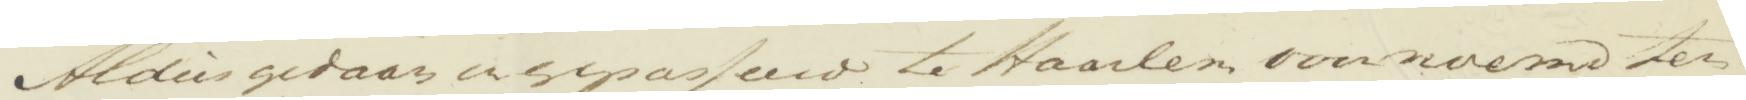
Aldus gedaan en gepasseerd te Haarlem voornoemd ten
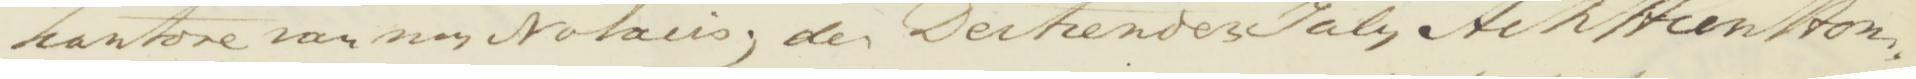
kantore van my Notaris; den Dertienden Iuly Achttien Hon„
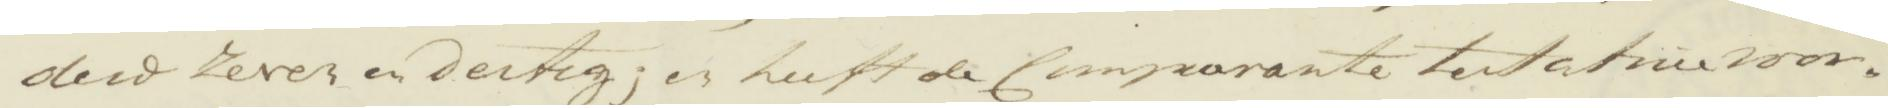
derd zeven en dertig; en heeft de Comparante testratrice voor„
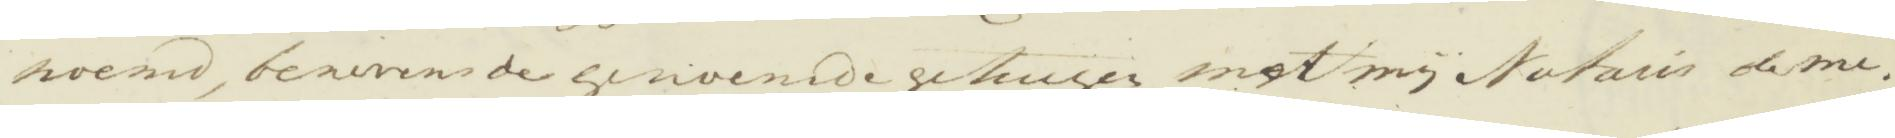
noemd, benevens de genoemde getuigen, met mij Notaris de mi„
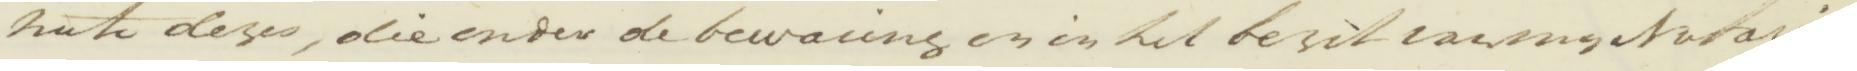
nute dezes, die onder de bewaring en in het bezit vanmy Notaris
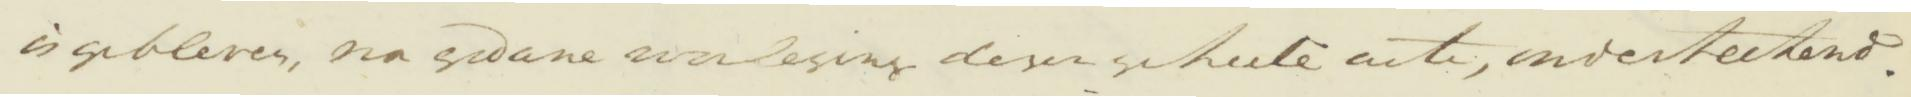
is gebleven, na gedane voorlezing dezer geheele acte, onderteeken.,
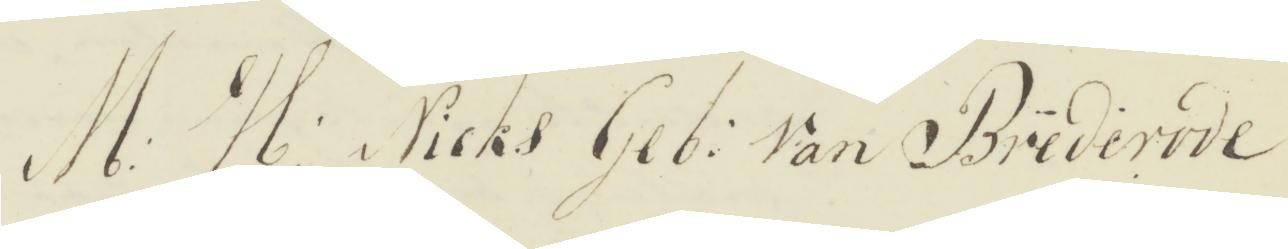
M: H: Nicks Geb: van Brederode
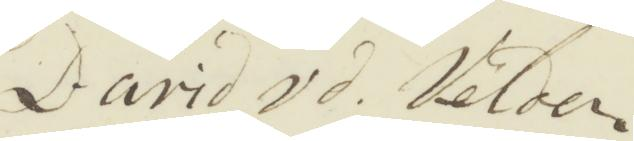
David vd. Velden
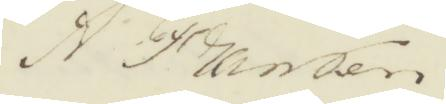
A Fransen
